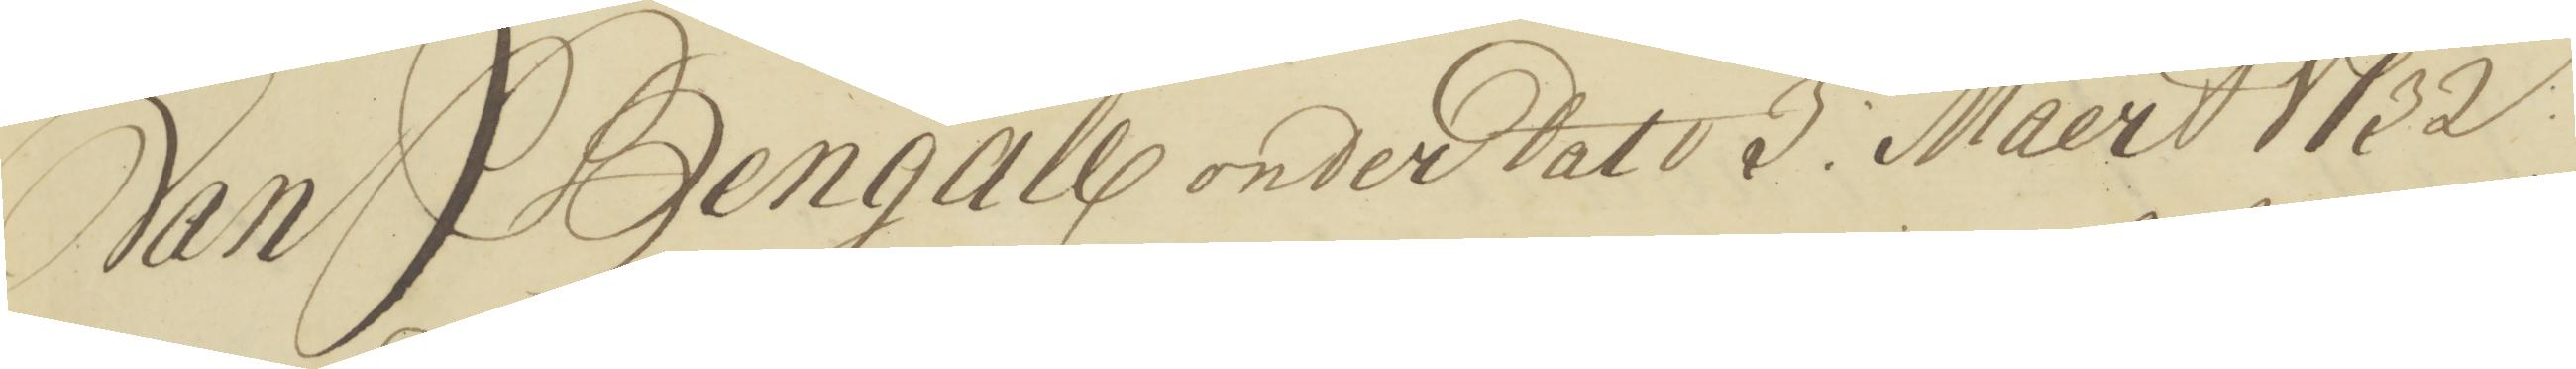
Van Bengale onder dato 3:e Maert 1732:
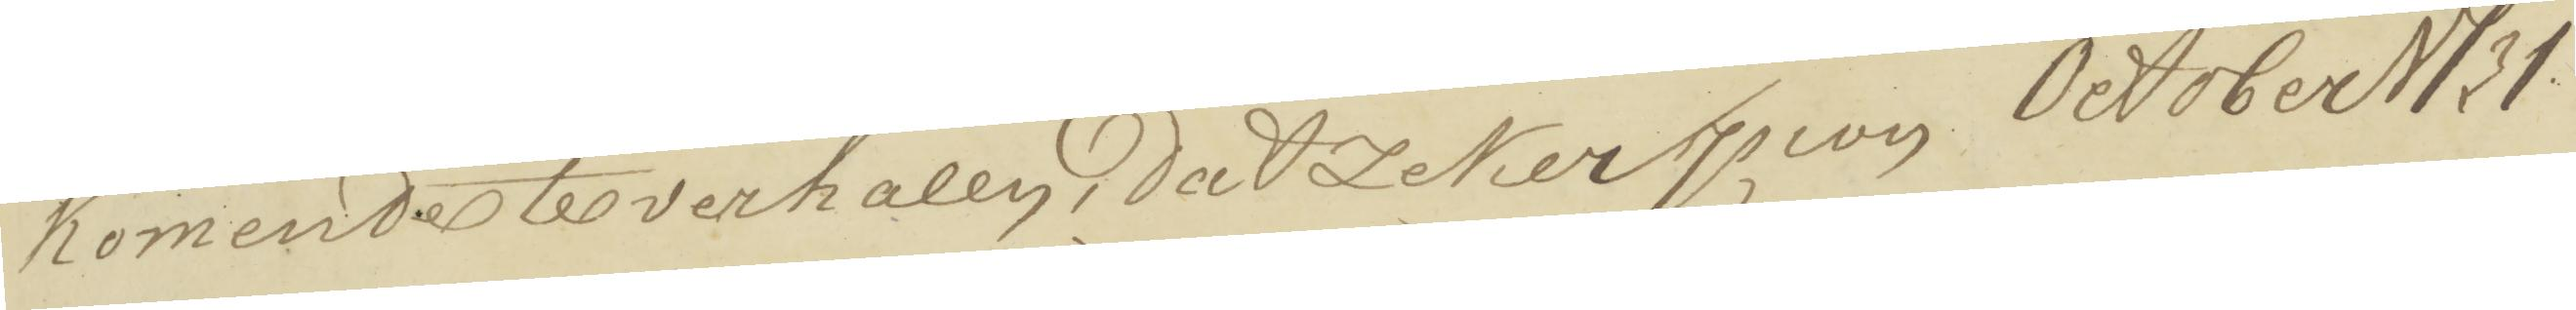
komende te verhalen, dat zeker pion October 1731:
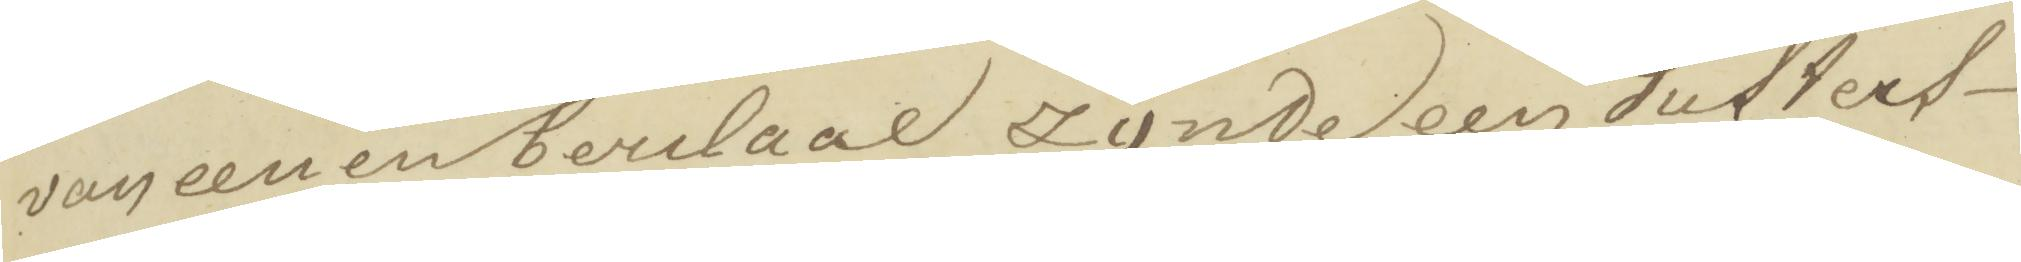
van eenen berilaal zijnde een Susters-
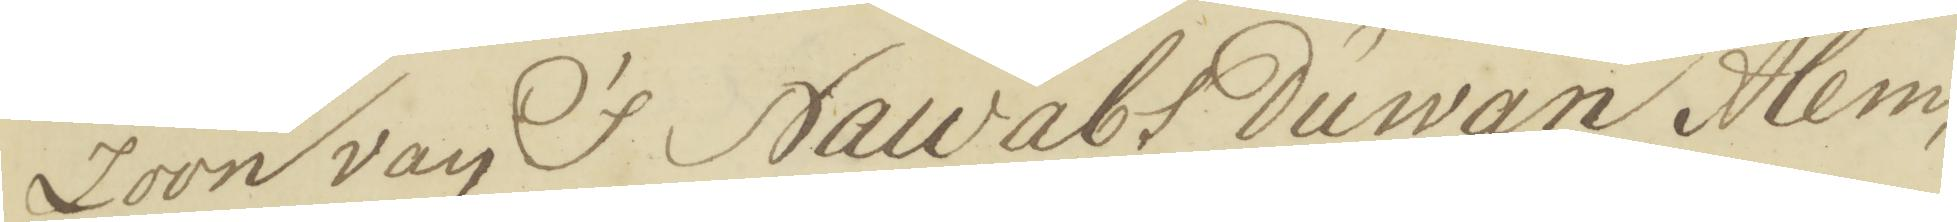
Zoon van 'S Nawabs duwan Alem„
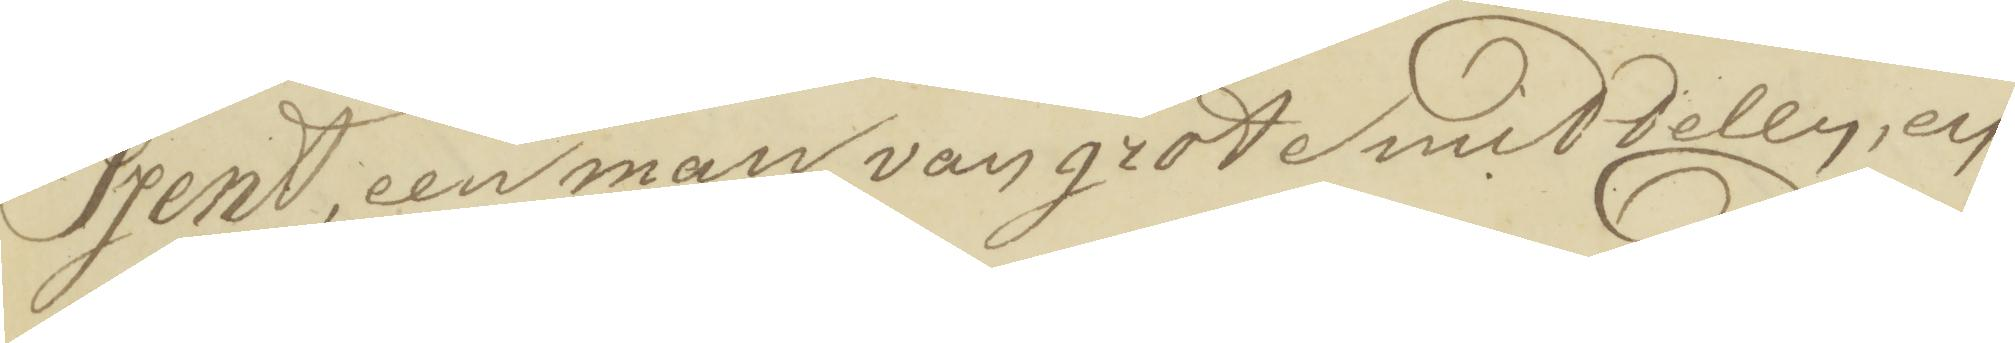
sjent, een man van grote middelen, en
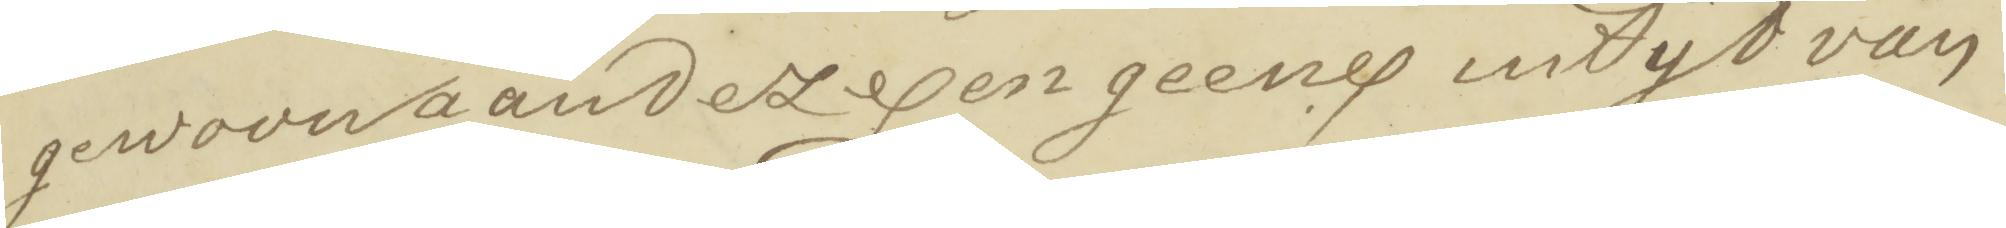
gewoon aan deze en geene in tijd van
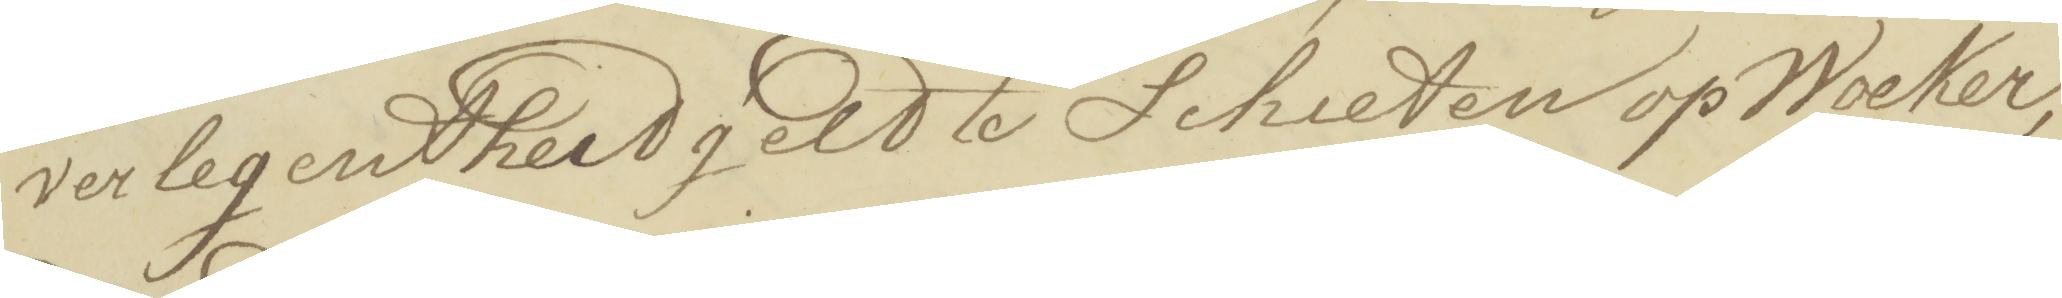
verlegentheid geld te Schieten op Woeker,
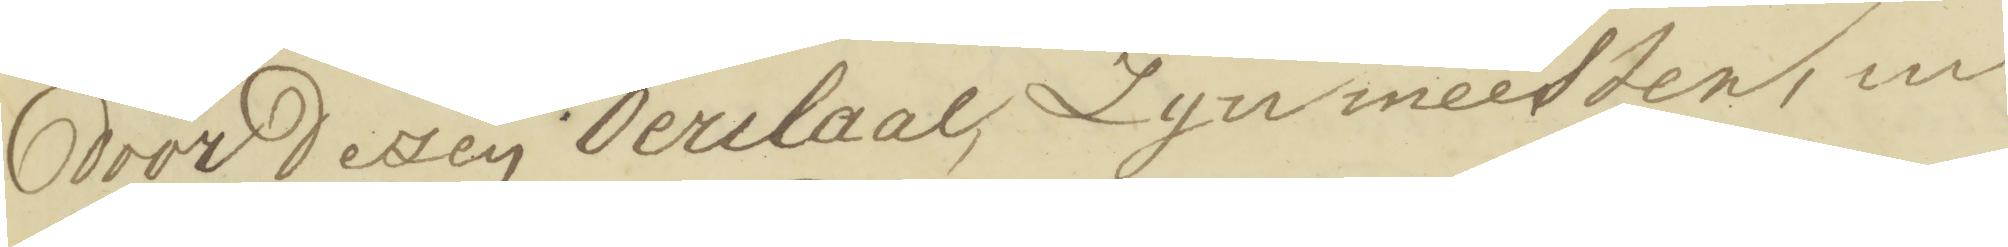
door dezen Oerilaal, Zijn meester, in
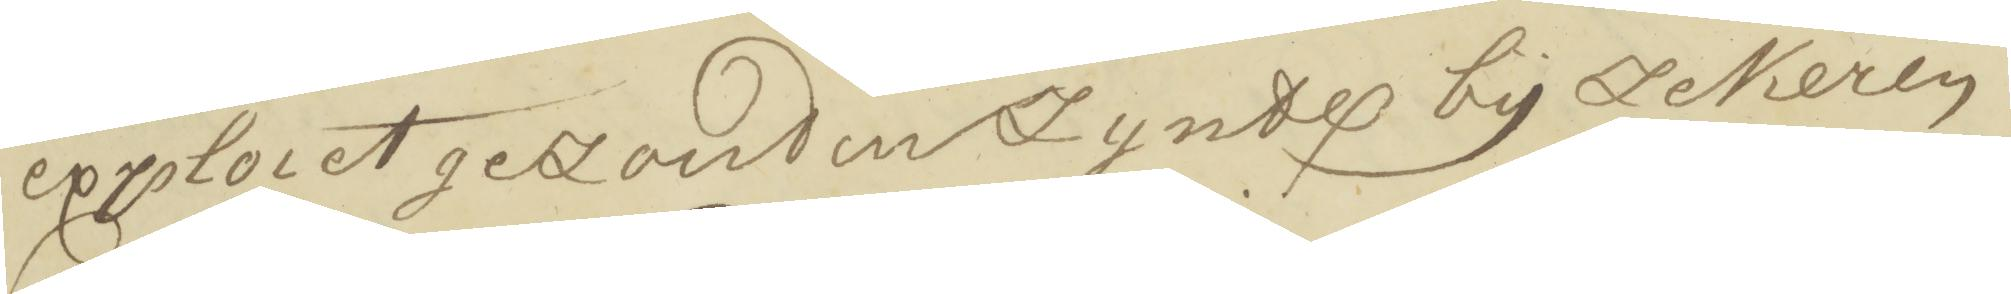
exploict gezonden zijnde bij zekeren
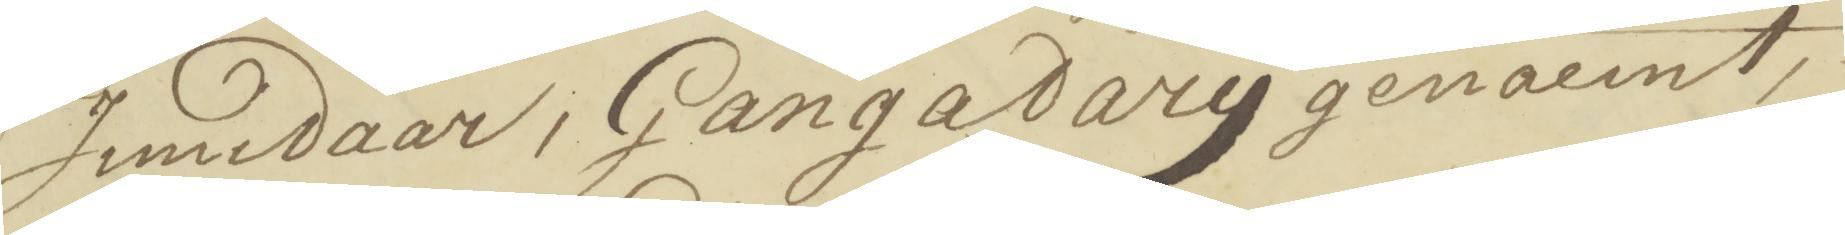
Jimidaar, Gangadarij genaemt,
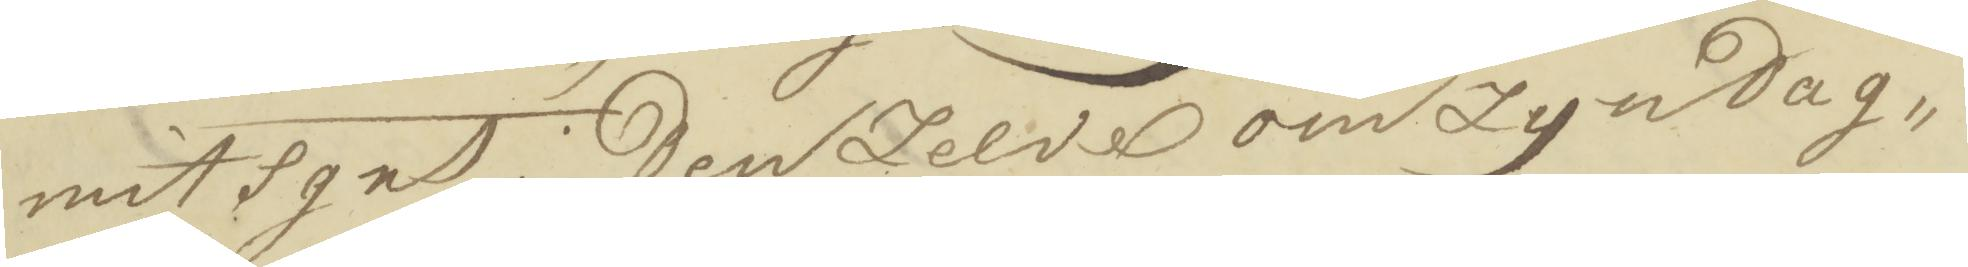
mitsgrs: den zelve om zyn dag„
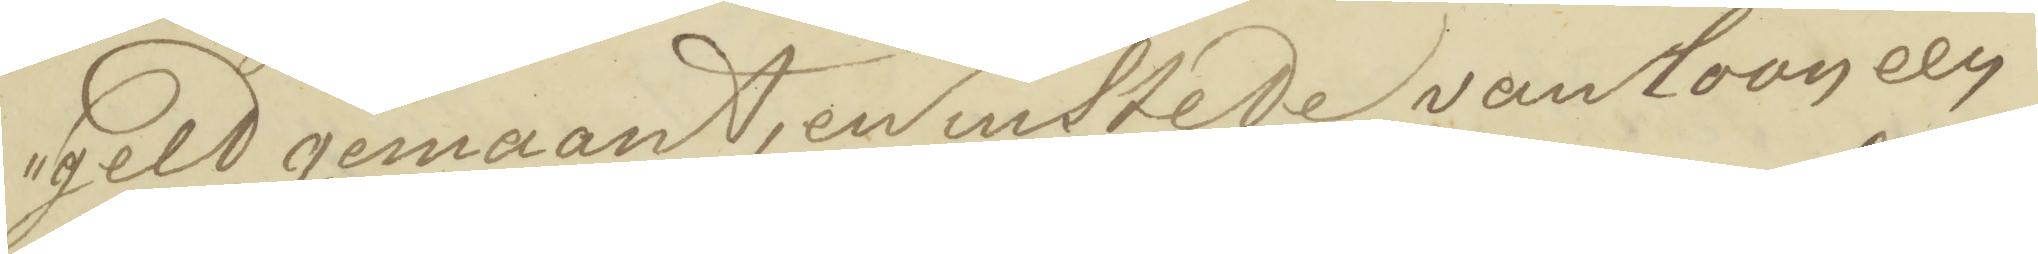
„geld gemaant, en instede van loon een
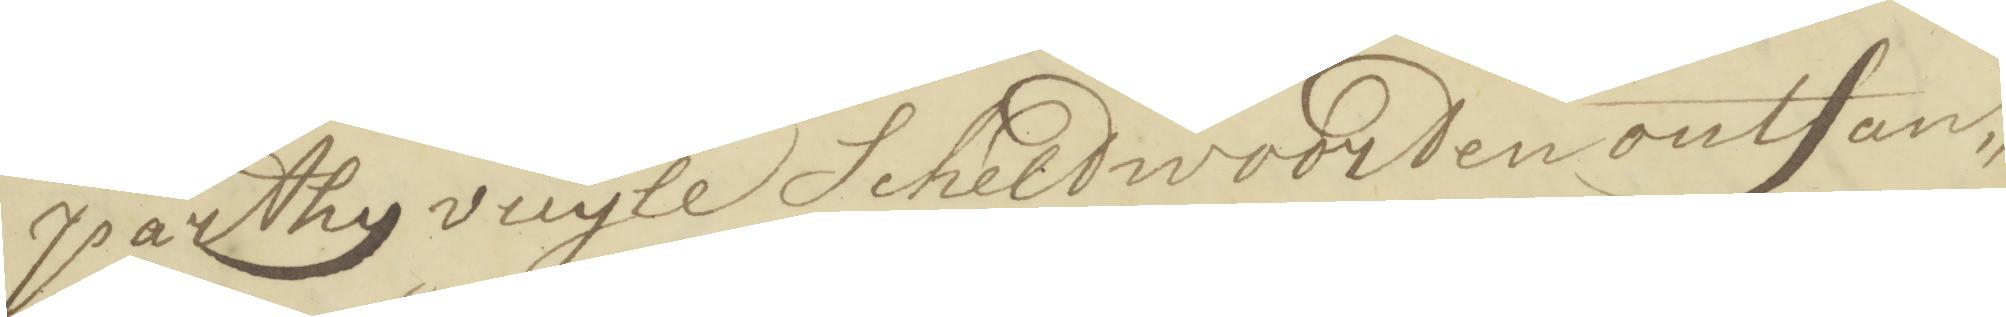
parthy vuijle Scheldwoorden ontfan„
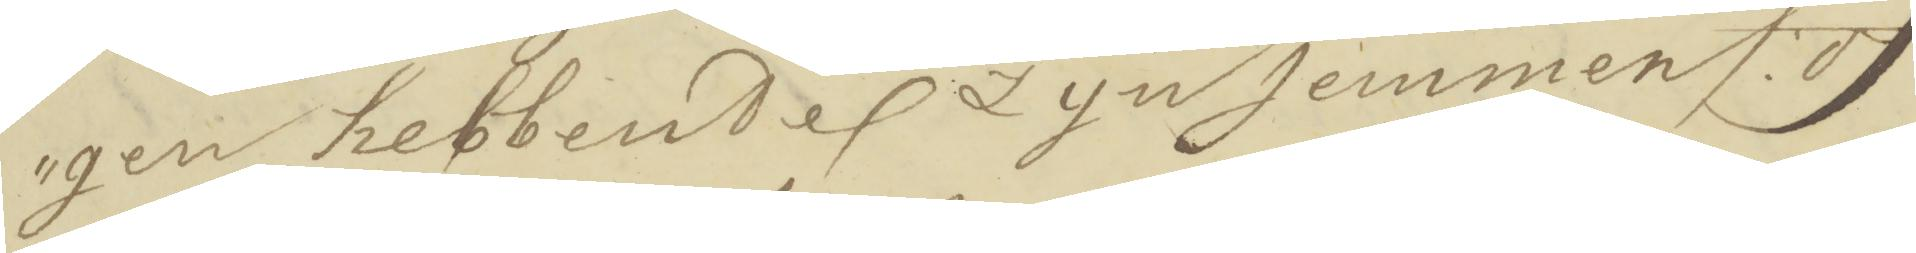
„gen hebbende zijn jemmer /: of
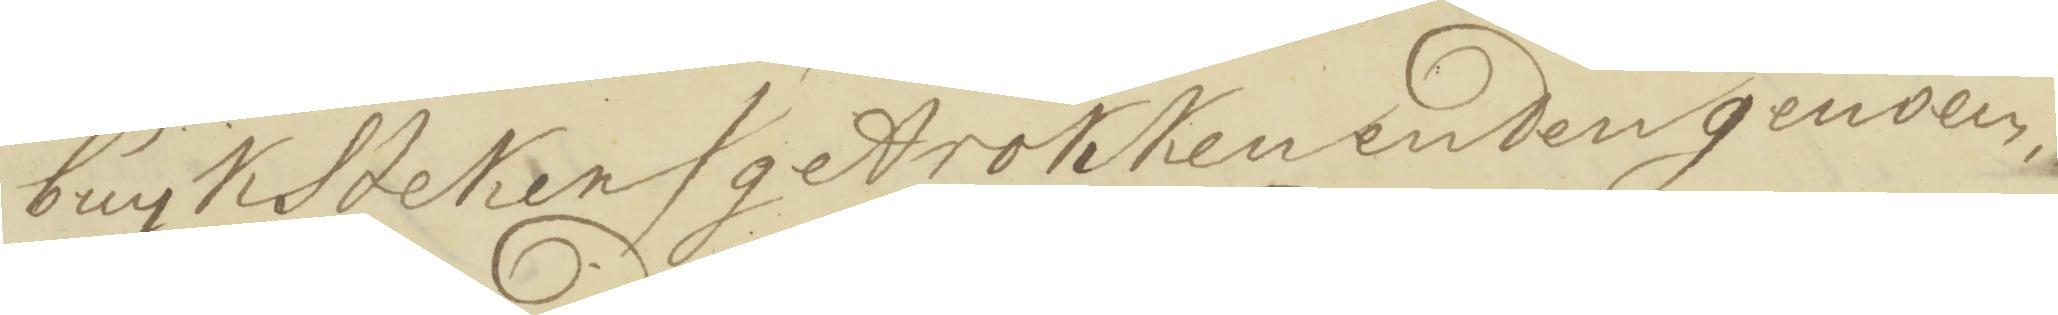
buijksteker / getrokken en den genoem„
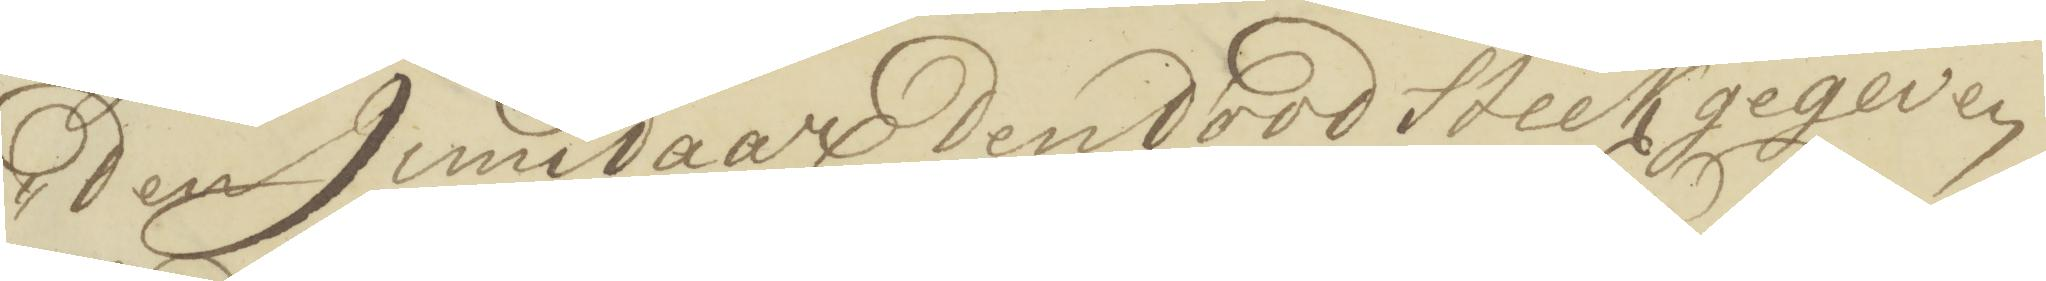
den Jimidaar den dood steek gegeven
